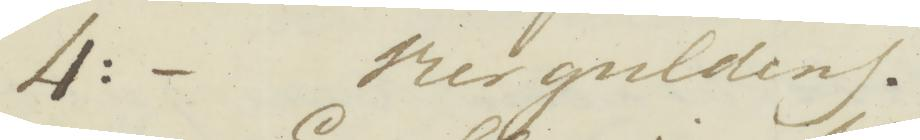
4: — Vier guldens.
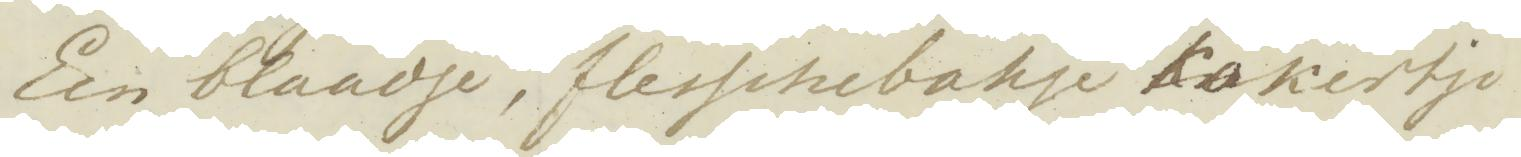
Een blaadje, flesschebakje kokertje
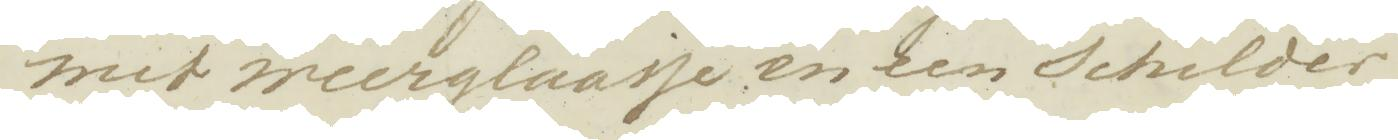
met weerglaasje en een schilder
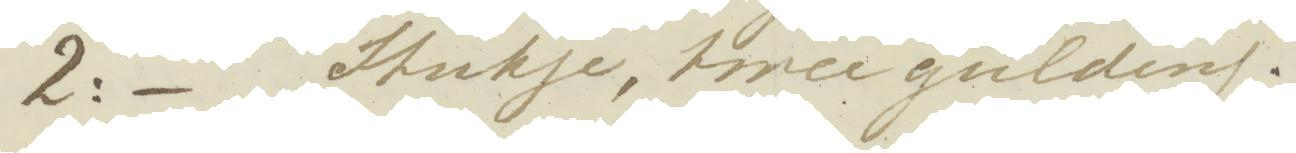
2: — stukje, twee guldens.
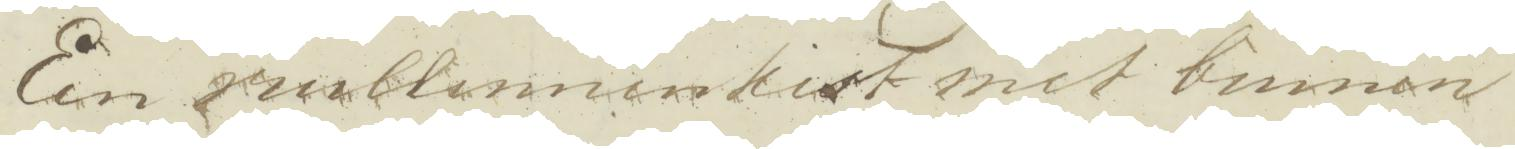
Een vuillinnen kist met binnen
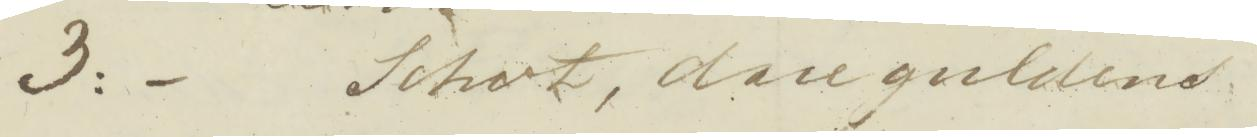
3: — schot, drie guldens
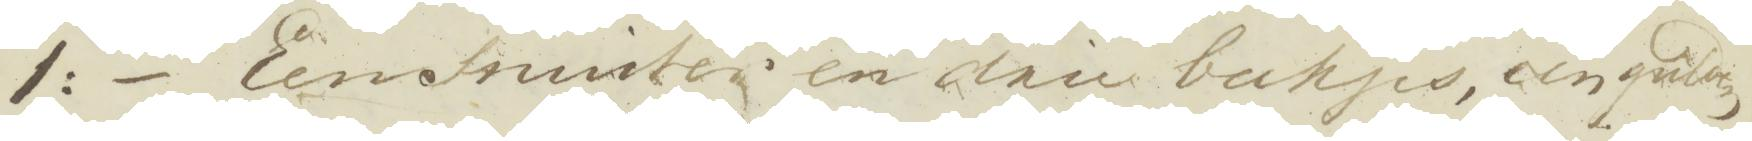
1: — Een struiter en drie bakjes, een gulden
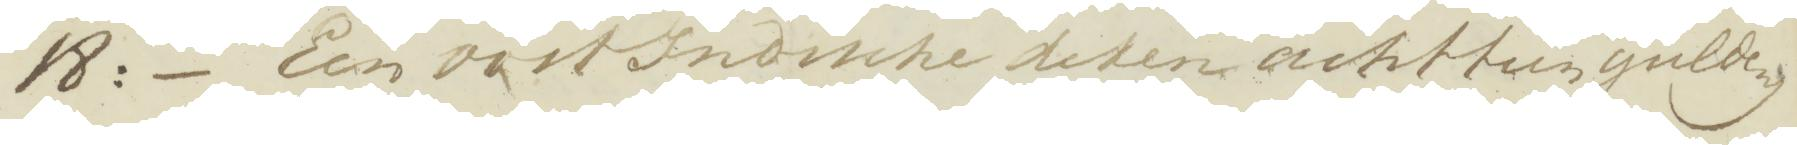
18: — Een oost Jndische dezen achttien guldens
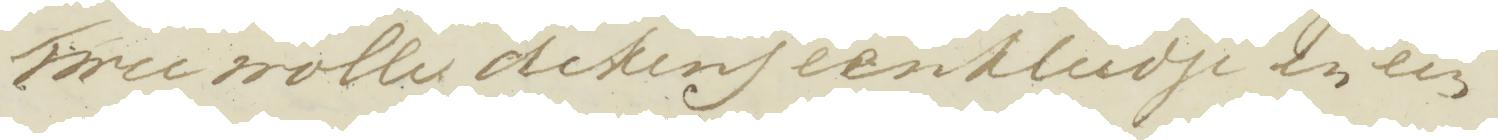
Twee wolle dekens een kleedje en een
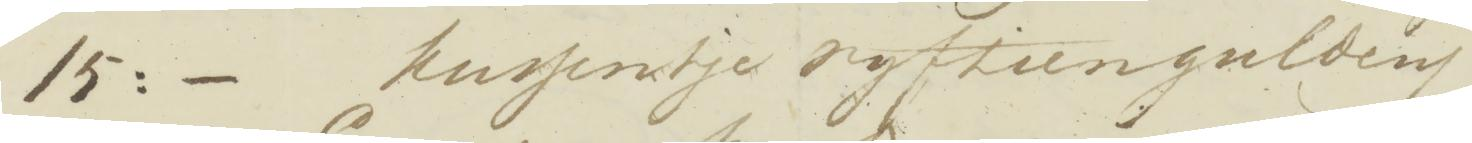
15:— kussentje vyftien guldens
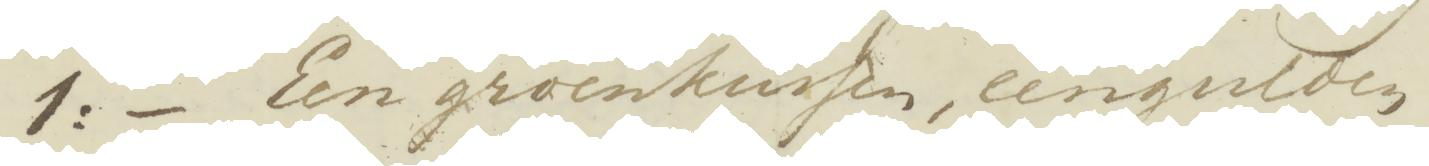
1: — Een groenkussen, een gulden
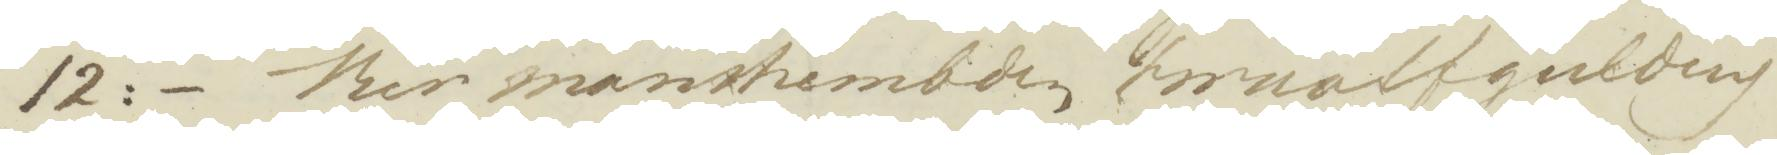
12: — Vier manshembden twaalf guldens
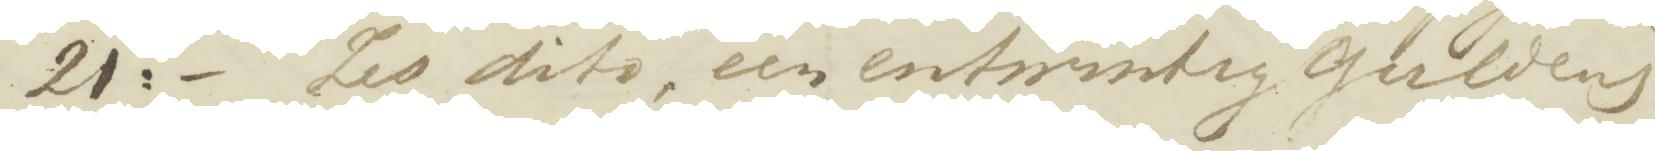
21: – Zes dito, een entwintig guldens
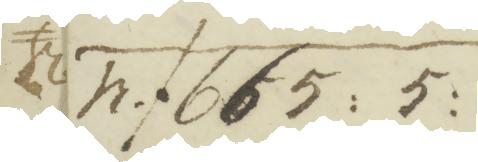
Tr. ƒ 665: 5:
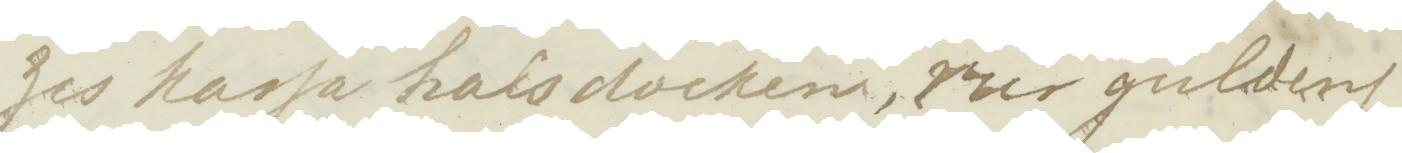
Zes kassa hals doeken, vier guldens
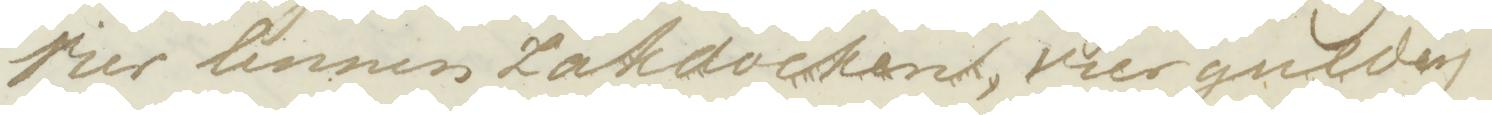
vier linnen zakdoeken, vier guldens
